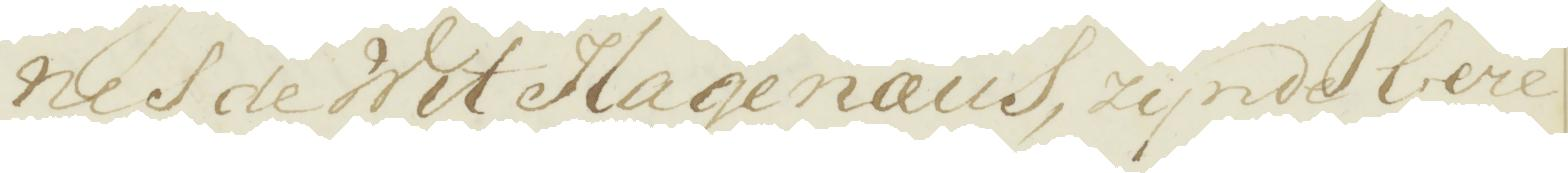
nes de Wit Hagenaus, zijnde Gere
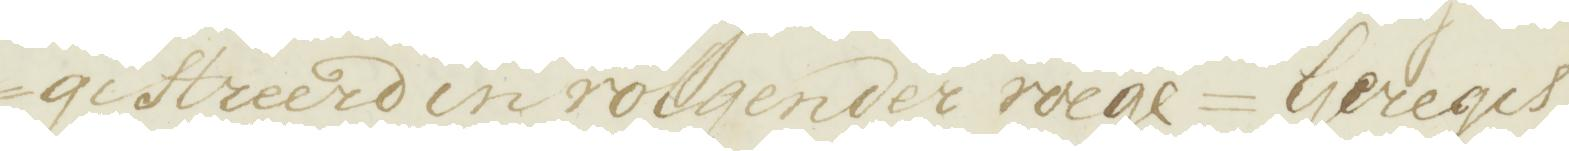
=gestreerd in volgender voege = Gereges
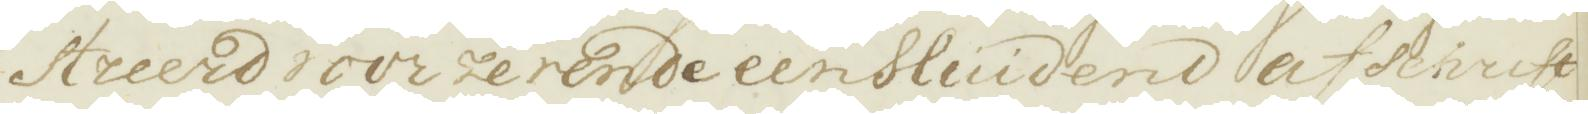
streerd voor zevende eensluidend afschrift
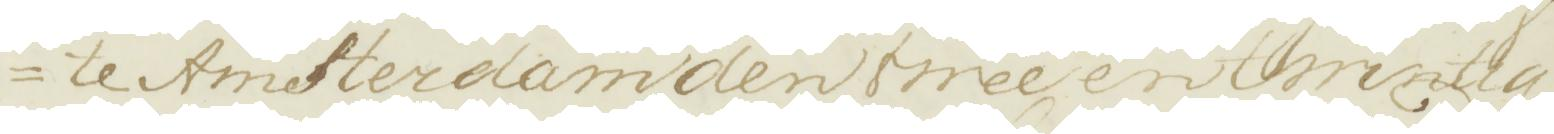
=te Amsterdam den twee en twintig
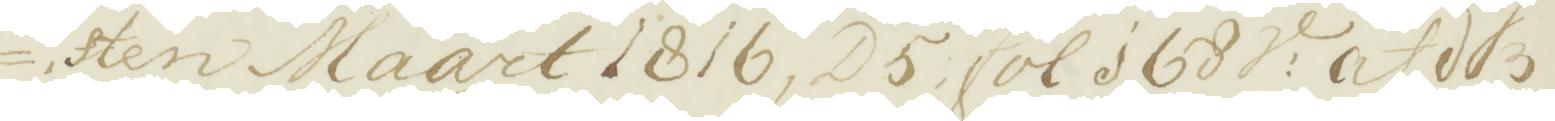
=sten Maart 1816, D5, fol I68 V: afd 3
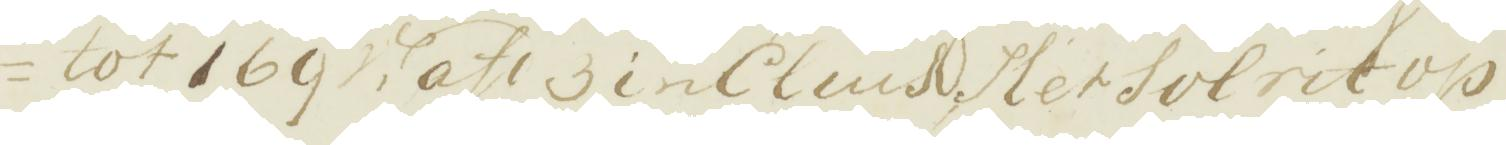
„tot 169 V, afd 3 inCluis Met Solvit op
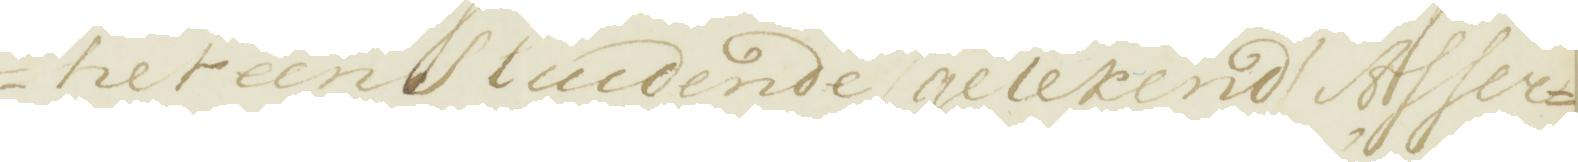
=het eensluidende /getekend/ Asser=
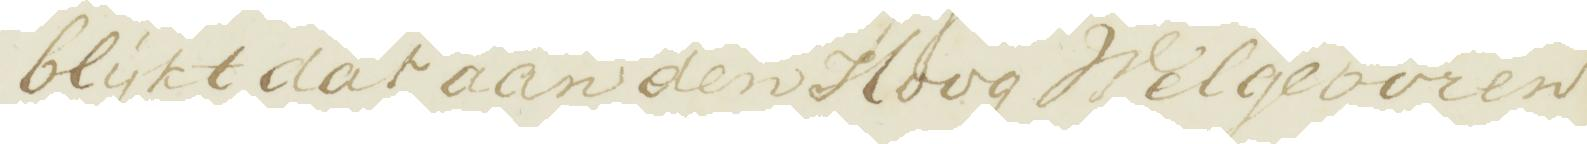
blijkt dat aan den Hoog Welgeboren
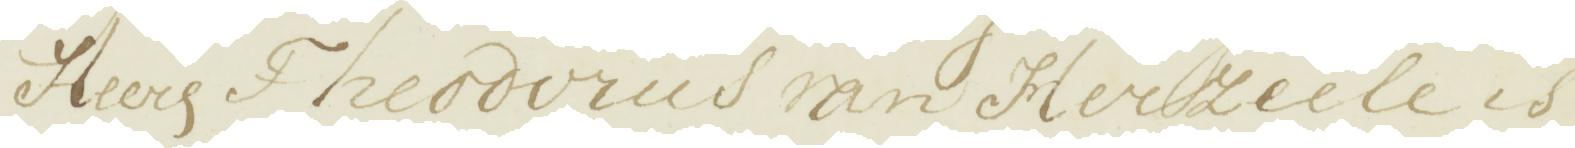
Heere Theodorus van Herzeele is
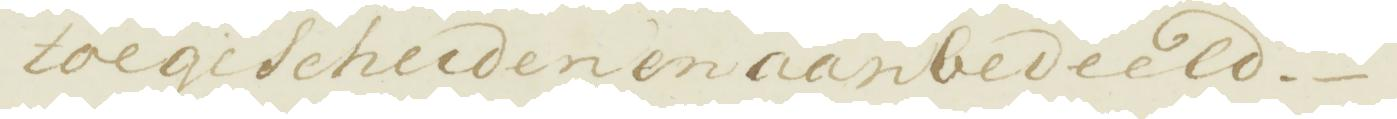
toegescheiden en aanbedeeld.-
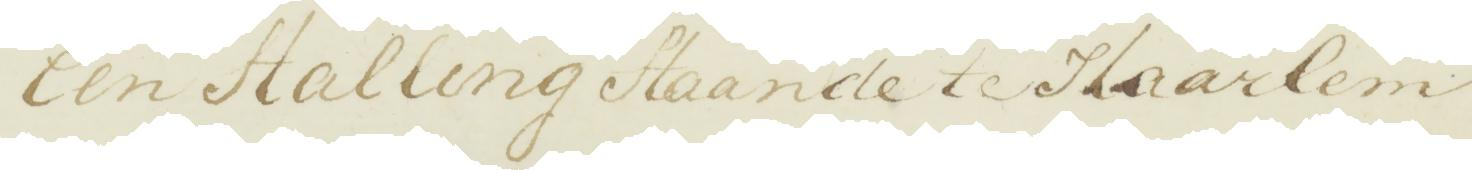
Een Stalling Staande te Haarlem
